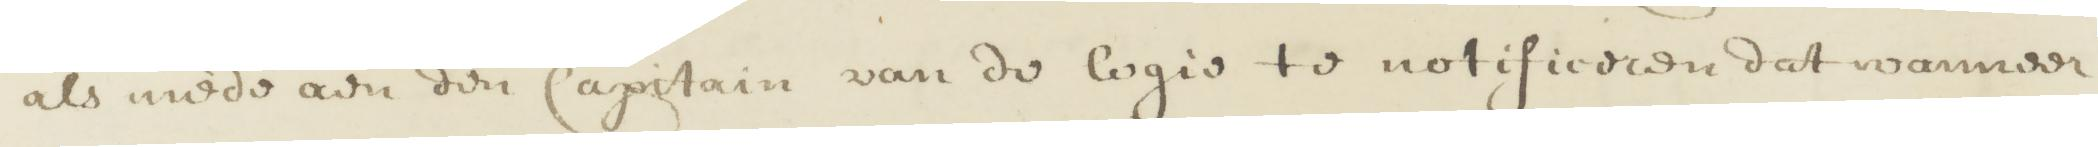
als mede aen den Capitain van de logie te notificeren dat wanneer
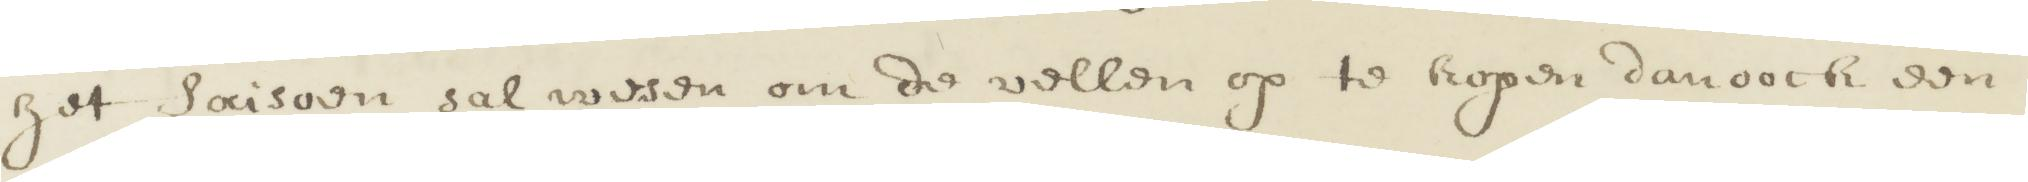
het saisoen sal wesen om de vellen op te kopen dan oock een
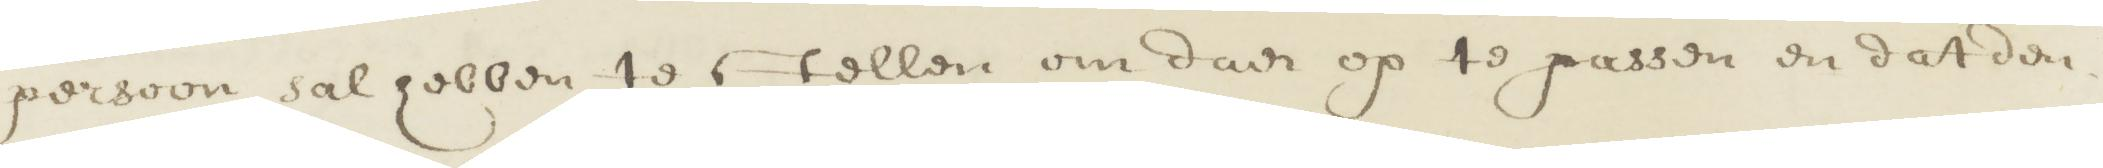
persoon sal hebben te stellen om daer op te passen en dat den
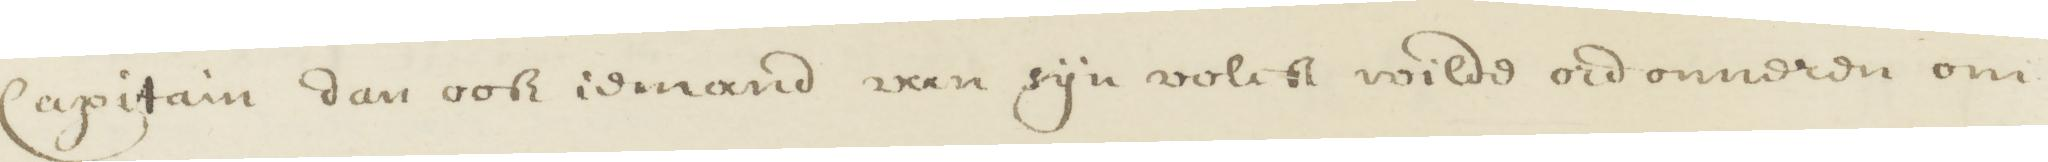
Capitain dan ook iemand van sijn volck wilde ordonneren om
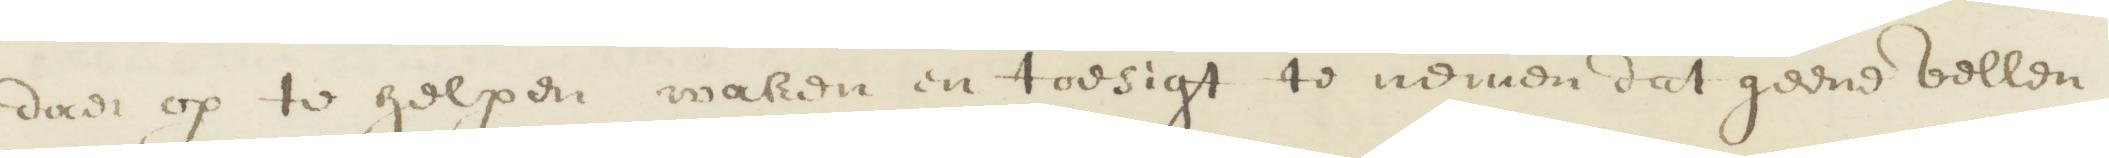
daer op te helpen waken en toesigt te nemen dat geene vellen
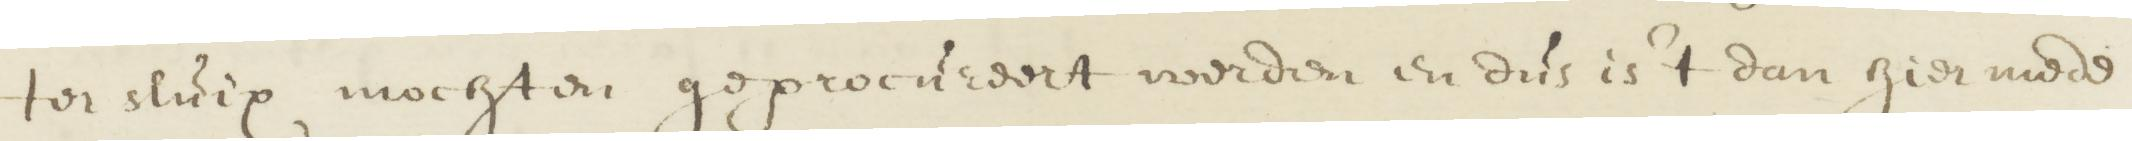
ter sluix mochten geprocureert werden en dus is ’t dan hier mede
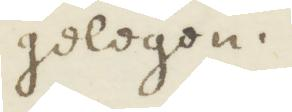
gelegen.
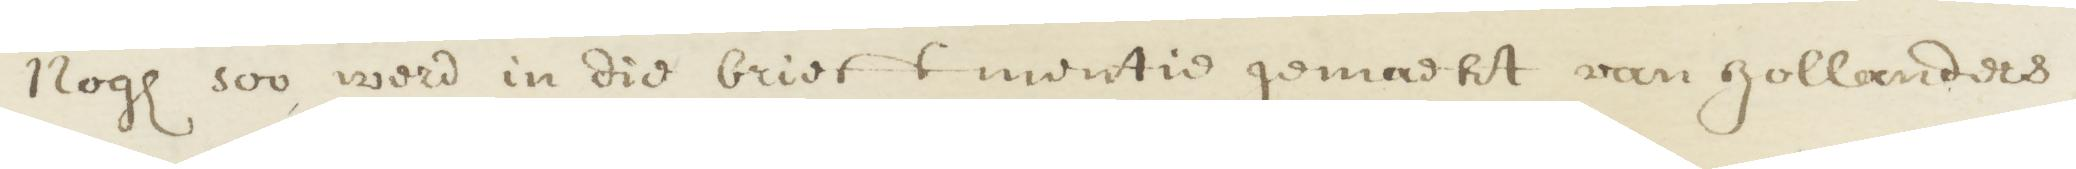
Nogh soo werd in die brieff mentie gemaekt van hollanders
